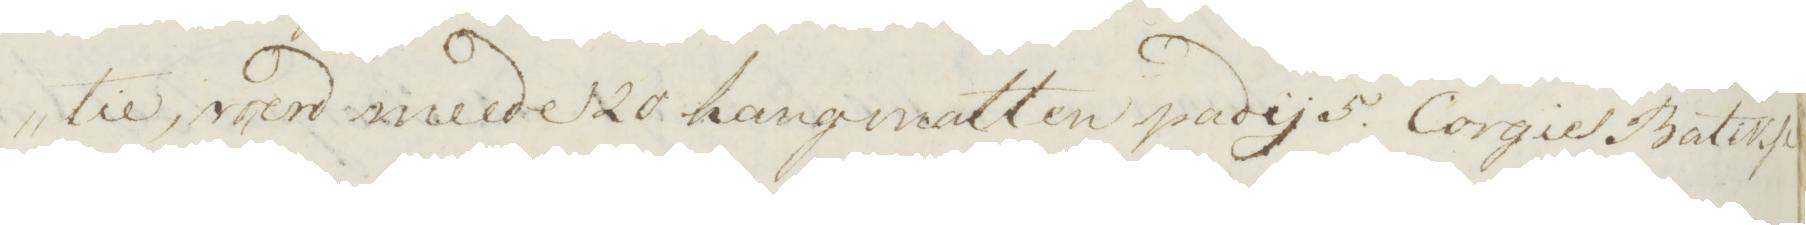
„tie, voerd meede 20 hangmatten padij 5. Corgies Batikse
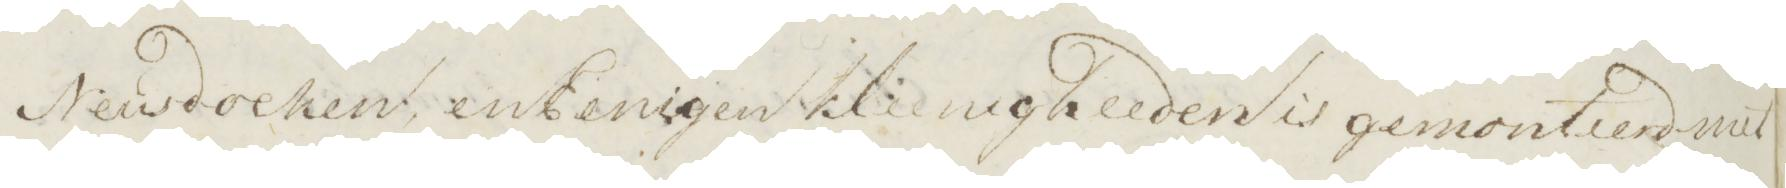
Neusdoeken, en Eenigen kleenigheeden is gemonteerd met
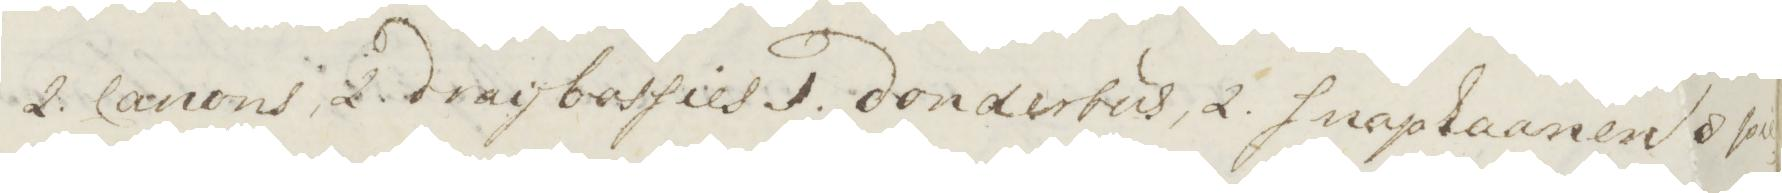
2. Canons, 2. draijbossies 1. donderbus, 2. snaphaanen 8 pie
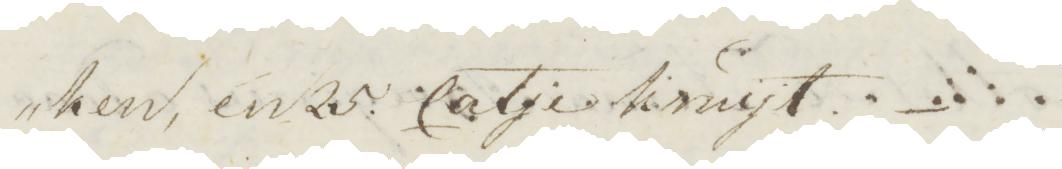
„ken, en 25. Catje kruijt. —
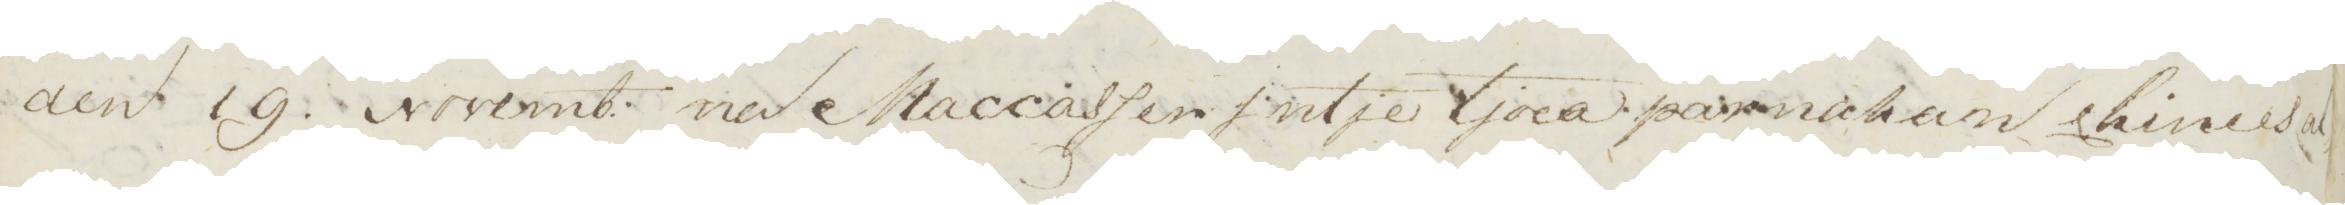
den 19. novemb: na Maccasser jntje tjoea parnakan Chinees al
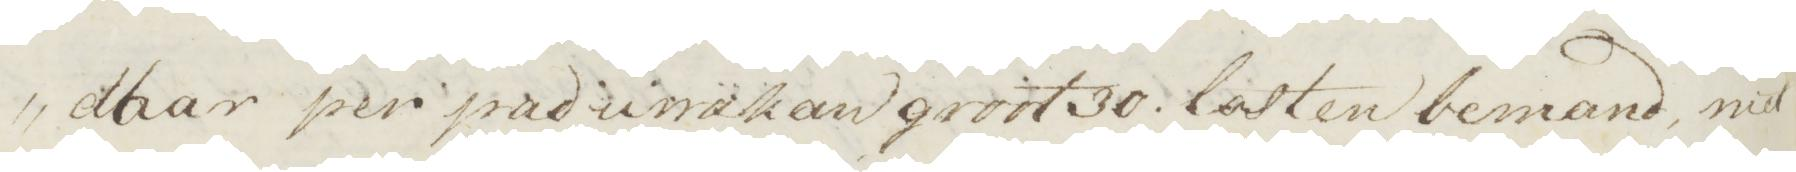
„daar per paduwakan groot 30. lasten bemand, met
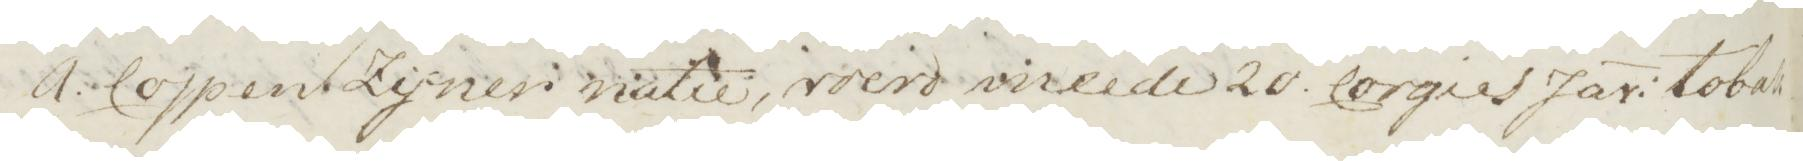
4. Coppen zijner natie, voerd meede 20. Corgies jav: tobak
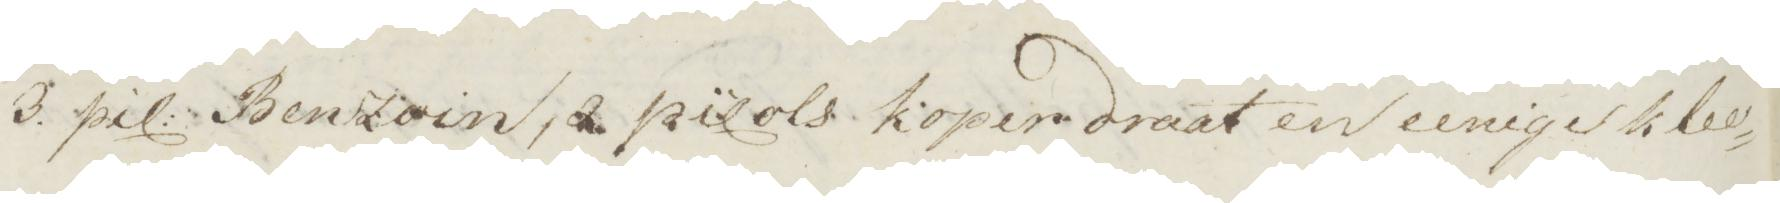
3. pic: Benzoin, 2. picols koper draat en eenige klee„
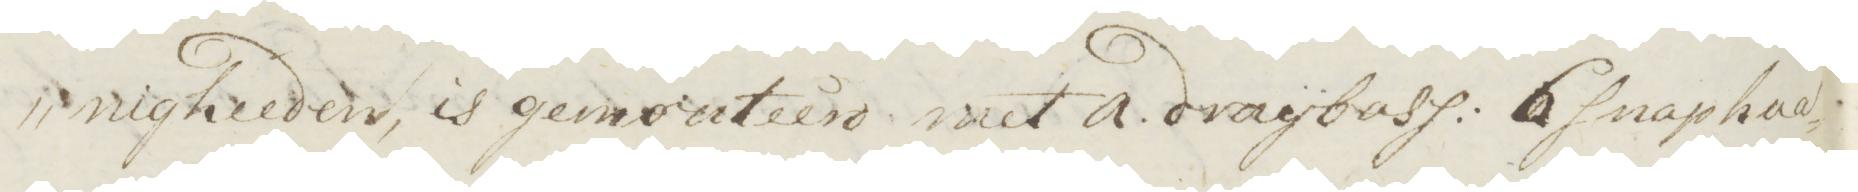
„nigheeden, is gemonteerd met 4. draijboss: 6 snaphaa„
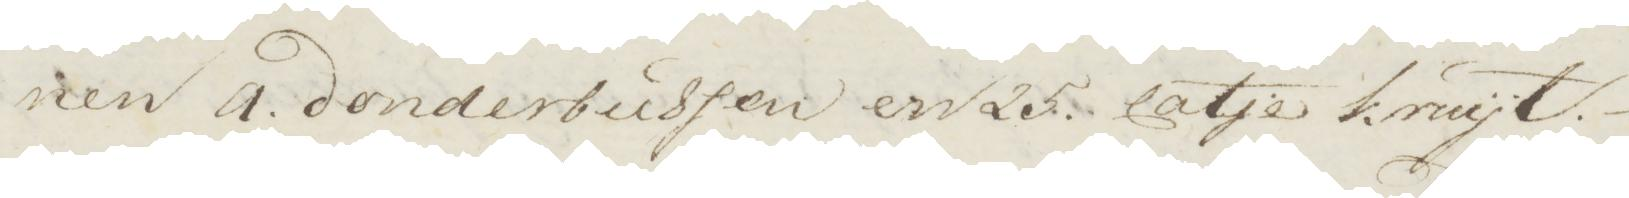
nen 4. donderbussen en 25. Catje kruijt. —
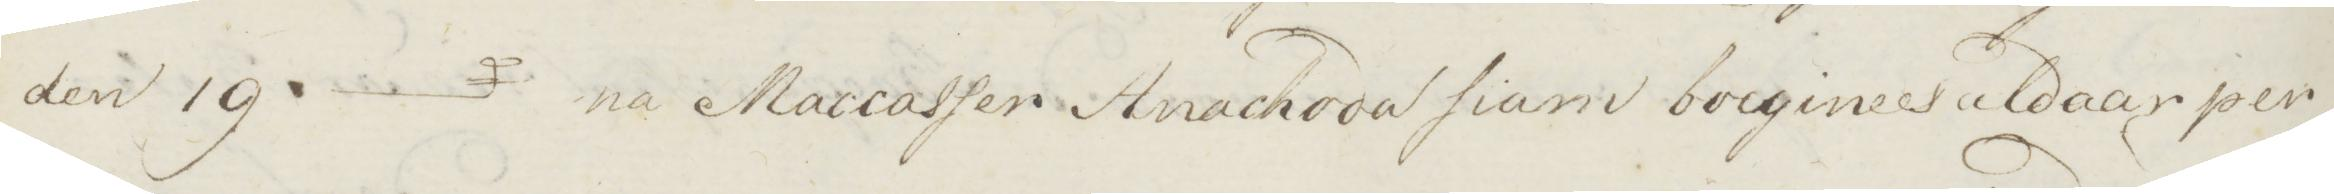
den 19 Do na Maccasser Anachoda siam boeginees aldaar per
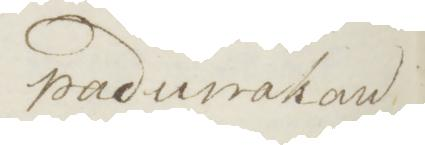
paduwakan
